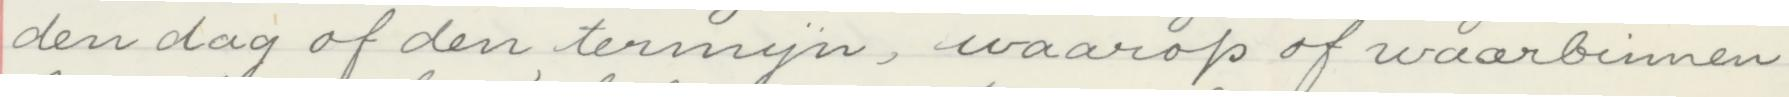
den dag of den termijn, waarop of waarbinnen
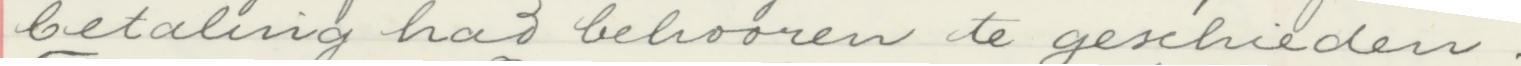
betaling had behooren de geschieden
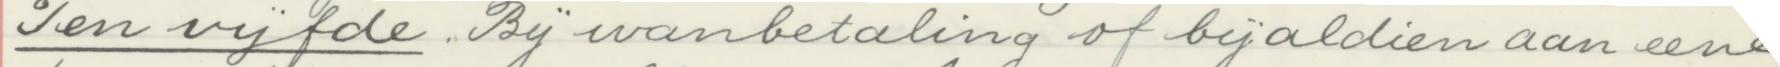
Ten vijfde. Bij wanbetaling of bij aldien aan eene
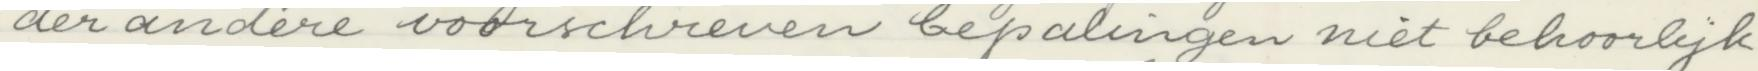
der andere voorschreven bepalingen niet behoorlijk
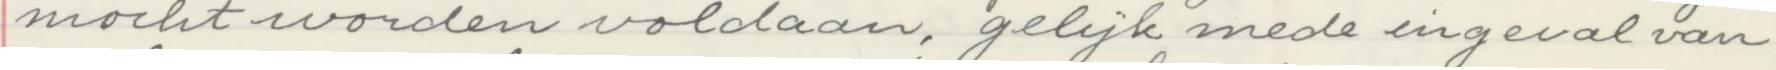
mocht worden voldaan, gelijk mede ingeval van
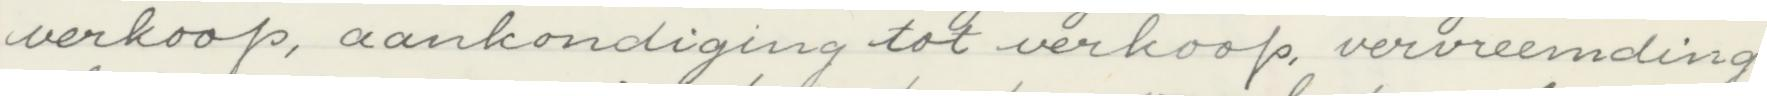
verkoop, aankondiging tot verkoop, vervreemding
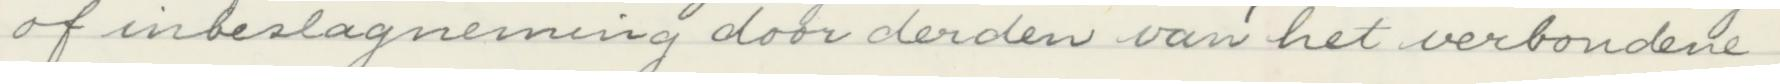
of inbeslagneming door derden van het verbondene
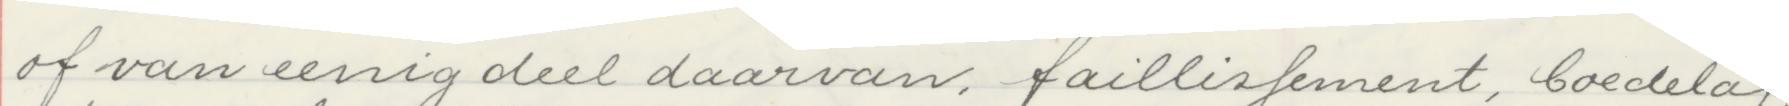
of van eenigdeel daarvan, faillissement, boedelaf
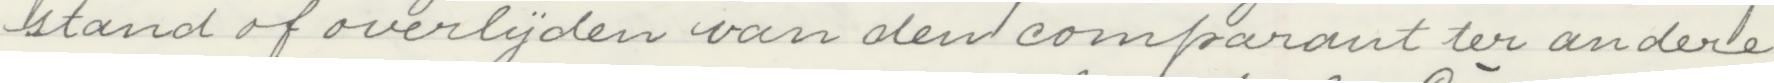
stand of overlijden van den comparant ter andere
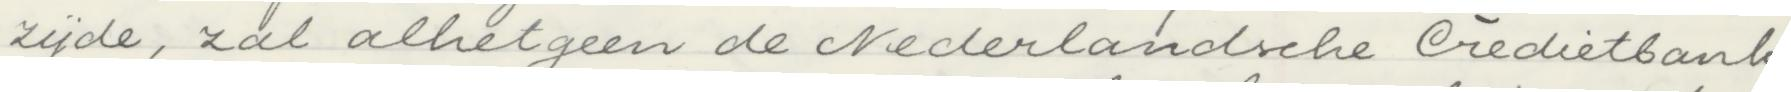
zijde, zal alhet geen de Nederlandsche Credietbank
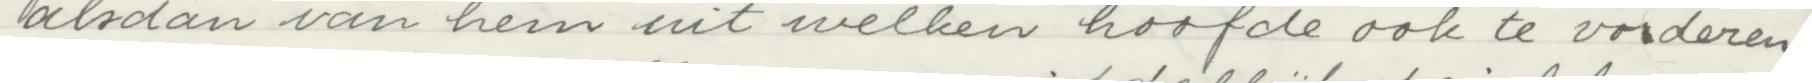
alsdan van hem uit welken hoofde ook te vorderen
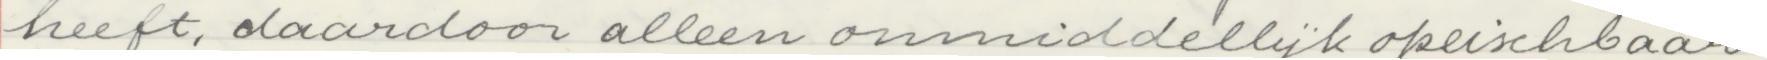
heeft, daardoor alleen onmiddellijk opeischbaar
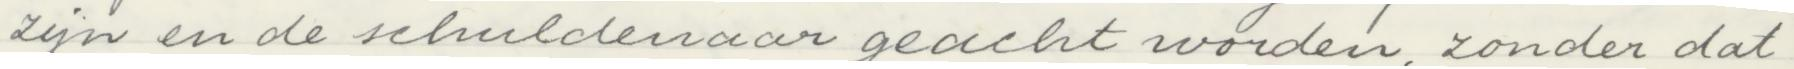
zijn en de schuldenaar geacht worden, zonder dat
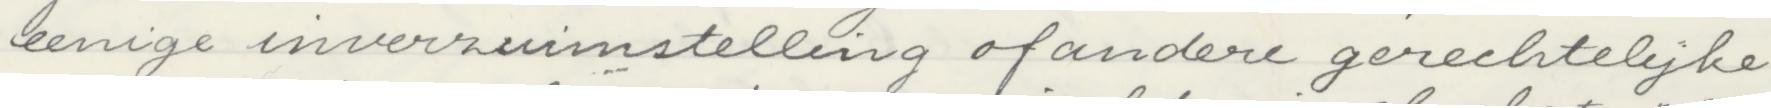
eenige inverzuimstelling of andere gerechtelijke
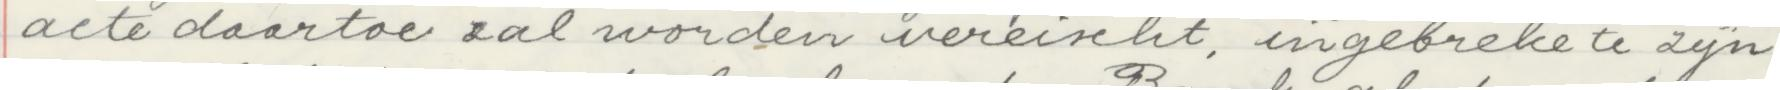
acte daartoe zal worden vereischt, ingebreke te zijn
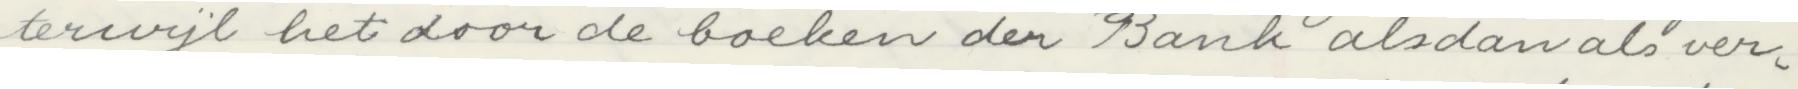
terwijl het door de boeken der Bank als dan als ver-
